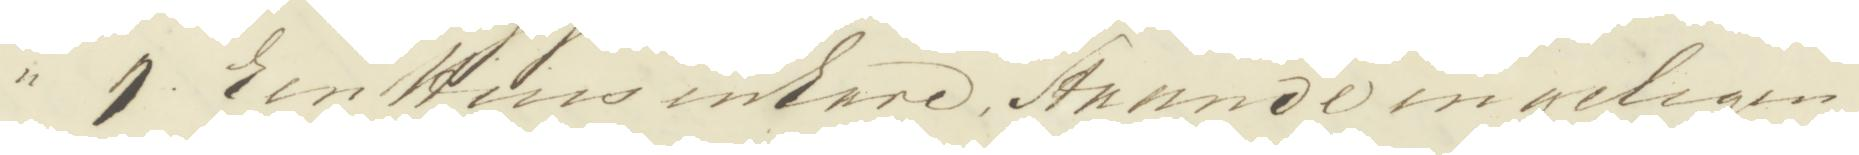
„ 9. Een Huis en Erve, staande en gelegen
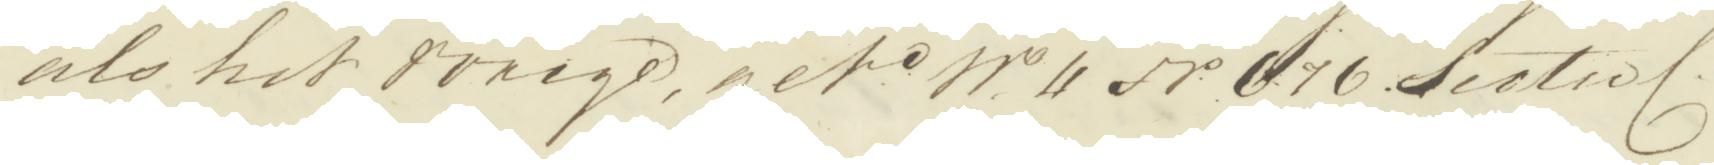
als het vorige, get.d W. 4 No 6.76 .Sectie C.
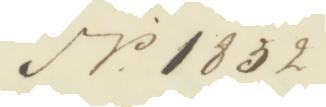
N. 1832
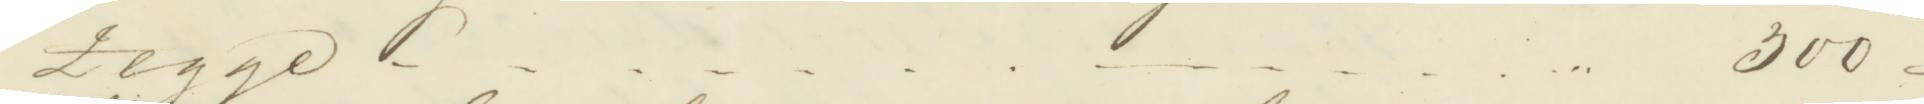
Zegge - - . - . . . - - - - . . . .. 300-
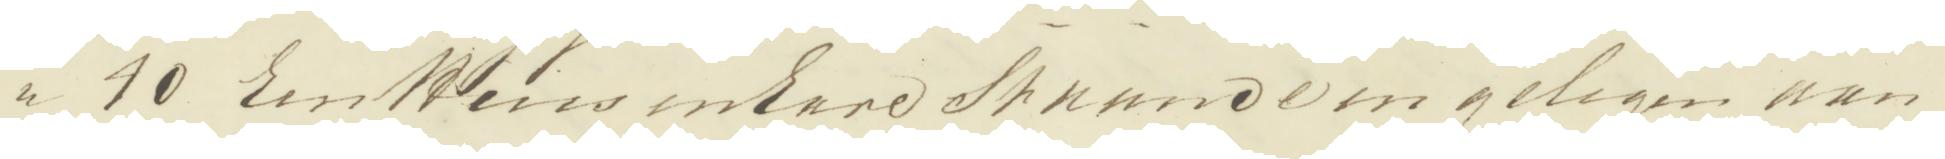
„ 10 Een Huis en Erve staande en gelegen aan
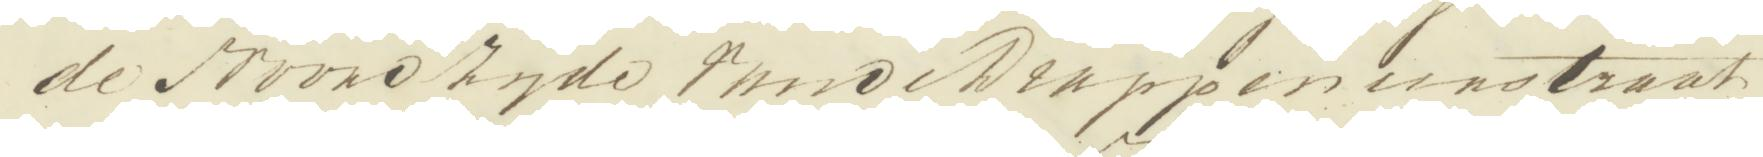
de Noord zyde Van de Drappenierstraat
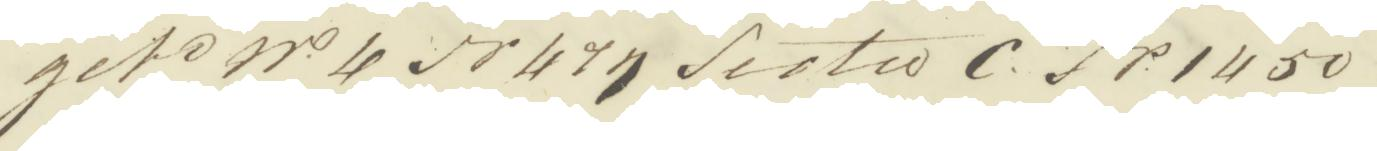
get.d W. 4 N 474 Sectie C. N. 1450
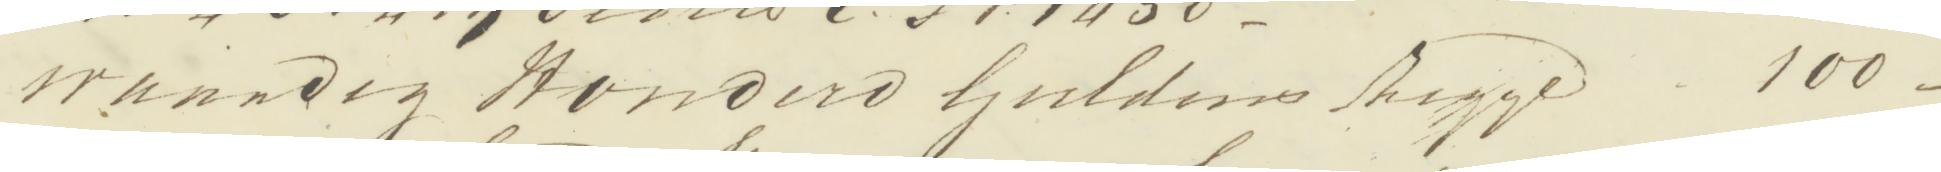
waardig Honderd Guldens Zegge - 100 -
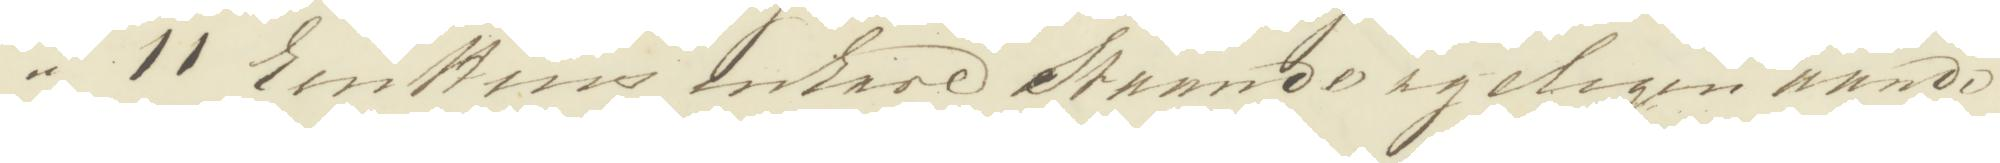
„ 11 Een Huis en Erve staande en gelegen aan de
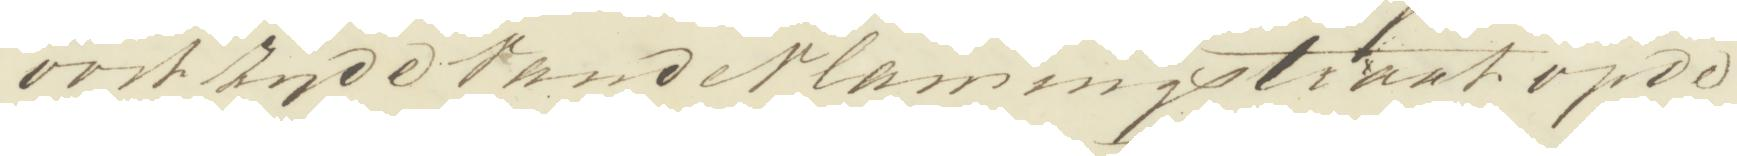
oost zyde van de Vlamingstraat op de
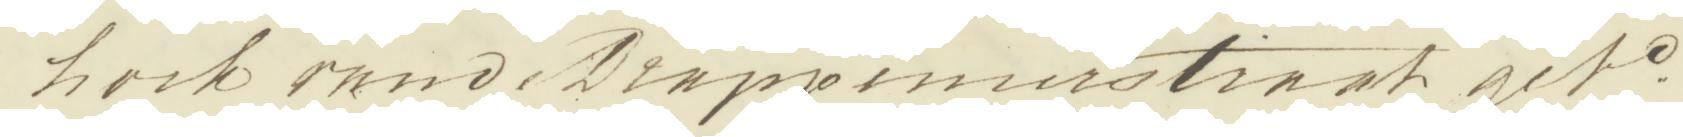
hoek van de Drappenierstraat get„d
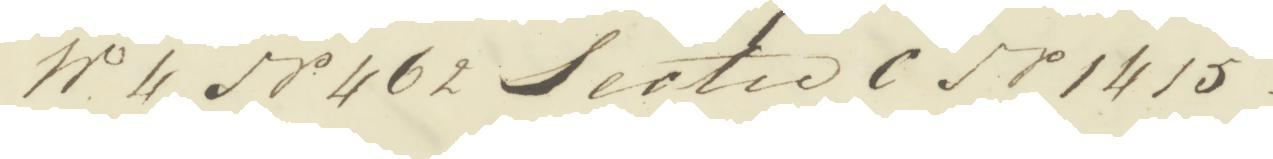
W. 4 N. 462 Sectie C No 1415
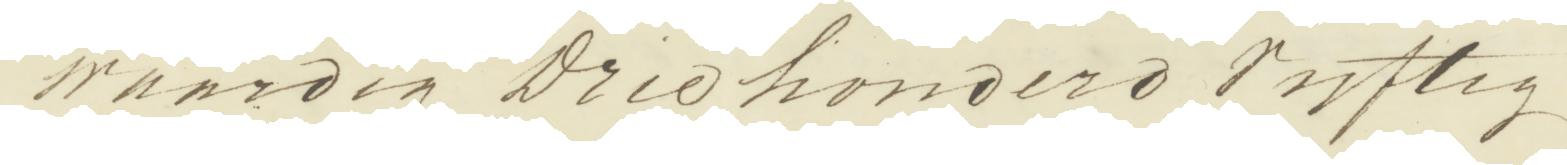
waardig Drie honderd Vyftig
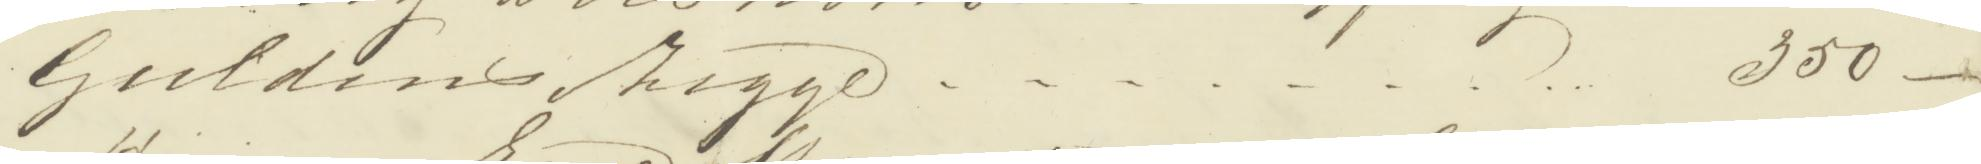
Gulden Zegge - - - . - - . . . 350 —
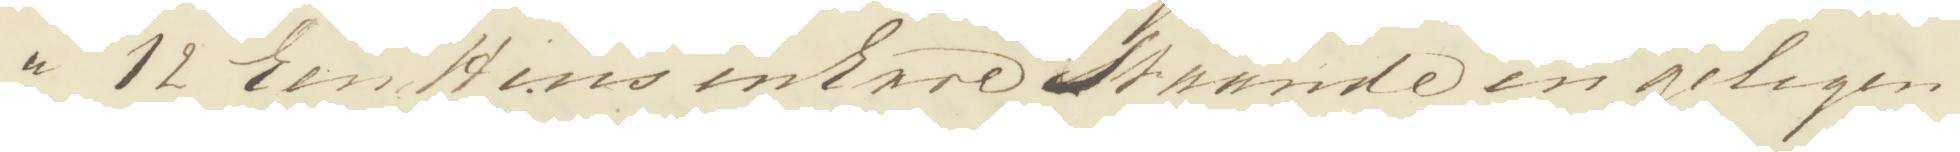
„ 12 Een Huis en Erve staande en gelegen
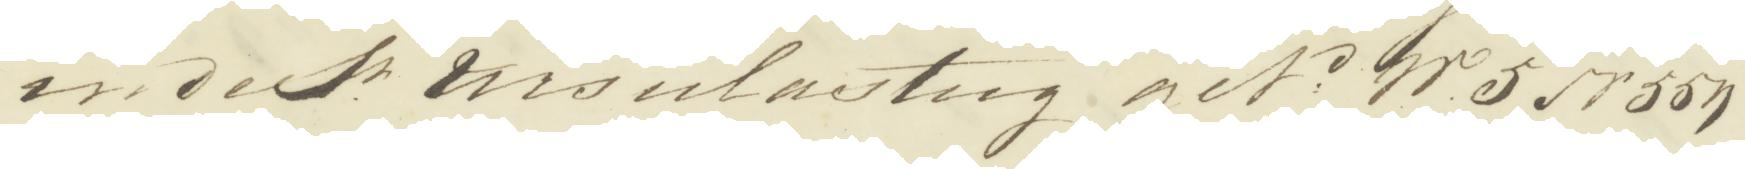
in de S.t Ursulasteeg get:d W.5 No 554
